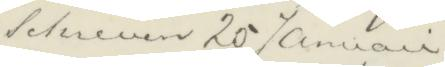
schreven 25 Januari
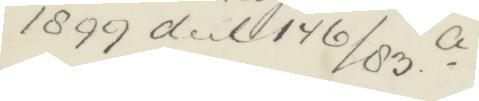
1899 deel 176/83.-a
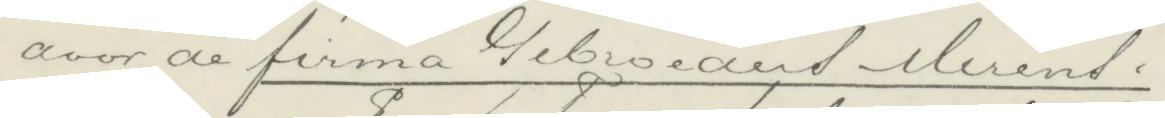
door de firma Gebroeders Merens.
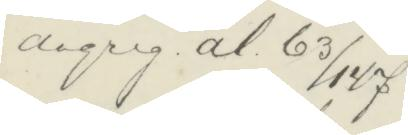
degrig al. 63/147
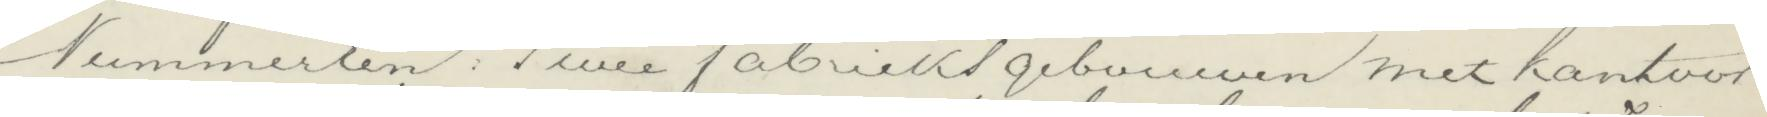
Nummer Een: twee fabrieks gebouwen met kantoor
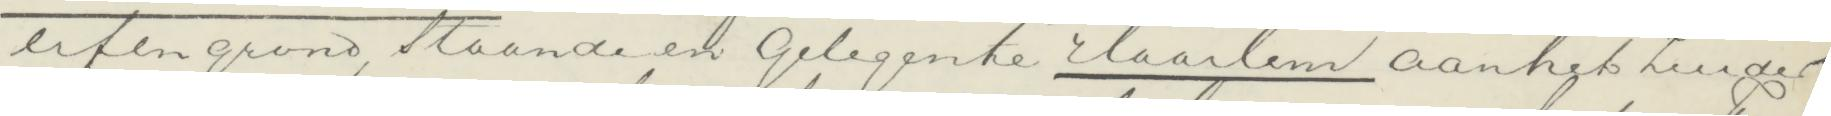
erf en grond, staande en Gelegen te Haarlem aan het Zuider
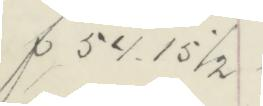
ƒ 57.15½
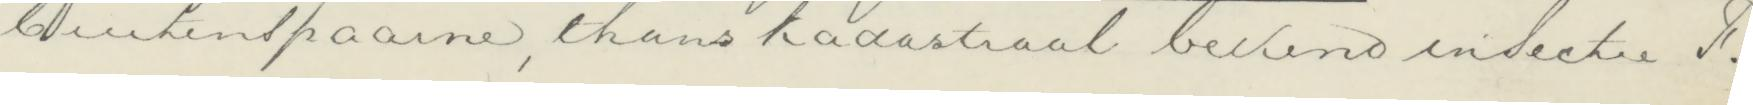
buitenspaarne, thans kadastraal beikend in sectie F.
